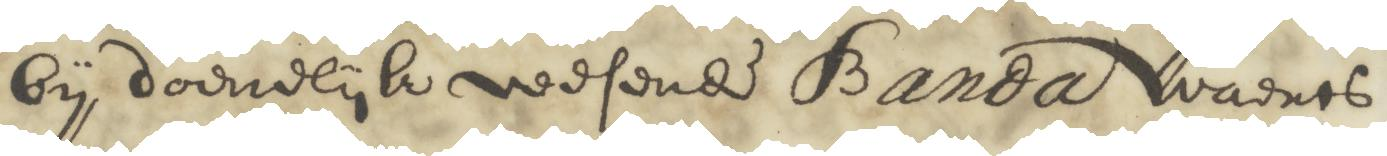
bij doenelijk wesende Banda waerts
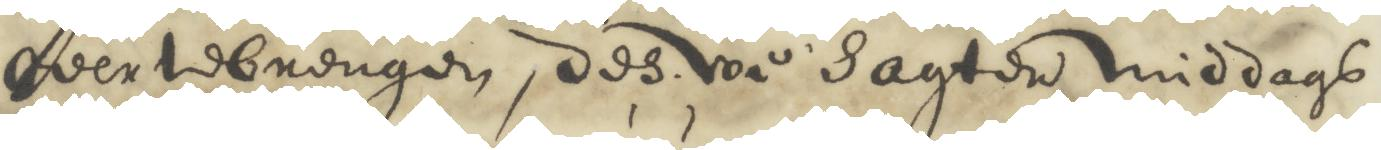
over tebrengen, des.we' 's agter middags
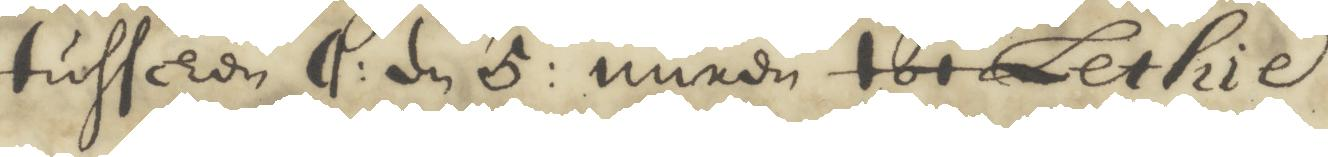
tusschen 4: en 5: uuren tot Lethie
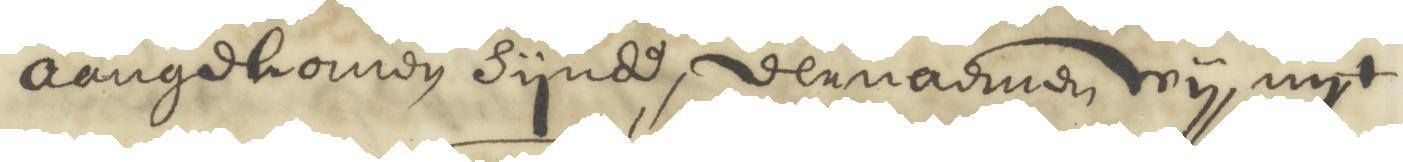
aangekomen sijnde, vernaemen wij uijt
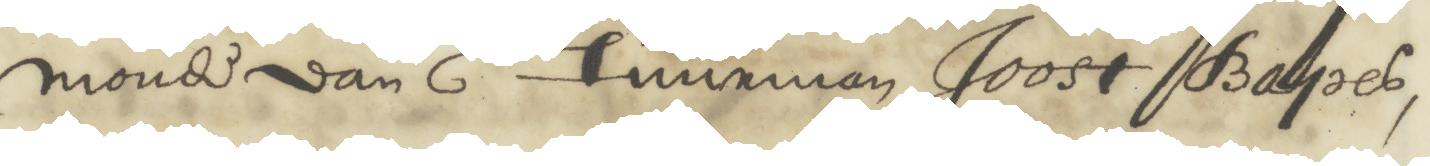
monde van stuurman Joost Bapes,
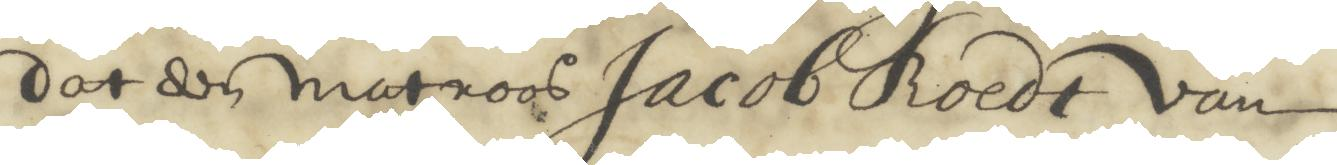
dat den matroos Jacob Roedt van
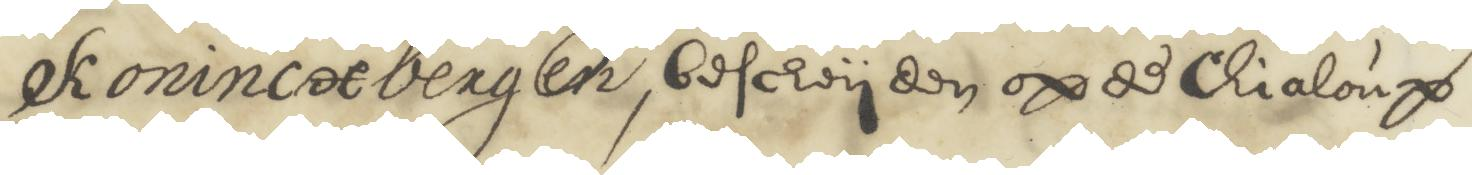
konincxbergen, bescheijden op de Chialoup
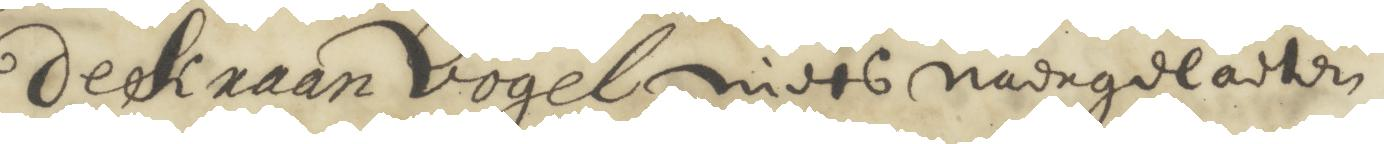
de Kraan Vogel, niets naergelaeten
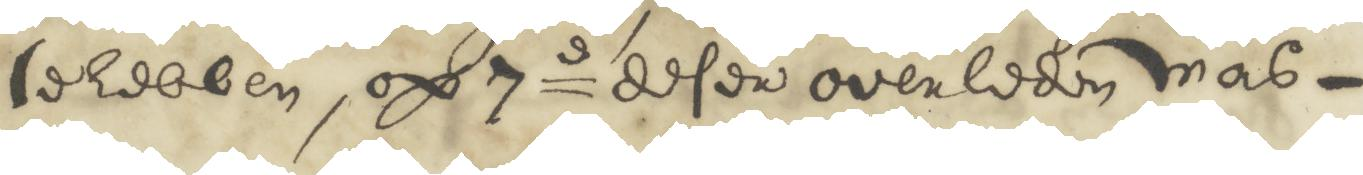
te hebben, op 7=e deser overleden was —
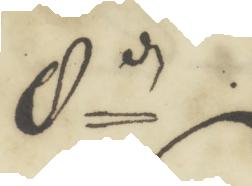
8=en
